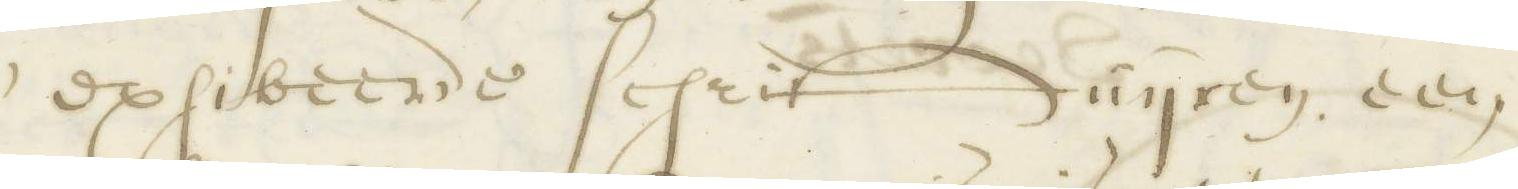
g'exhibeerde schriftuijren den
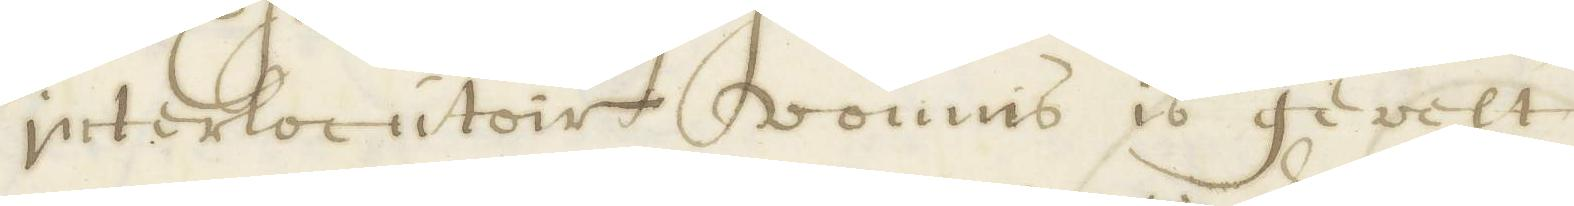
jnterlocutoir vonnis is gevelt
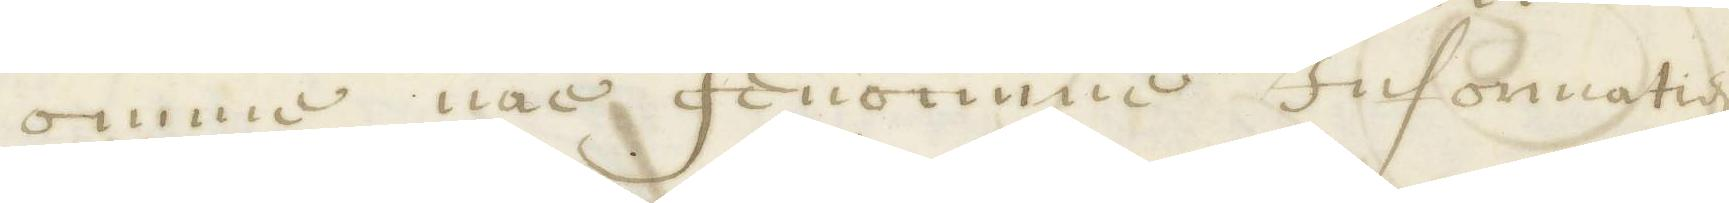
omme nae genomine Informatien
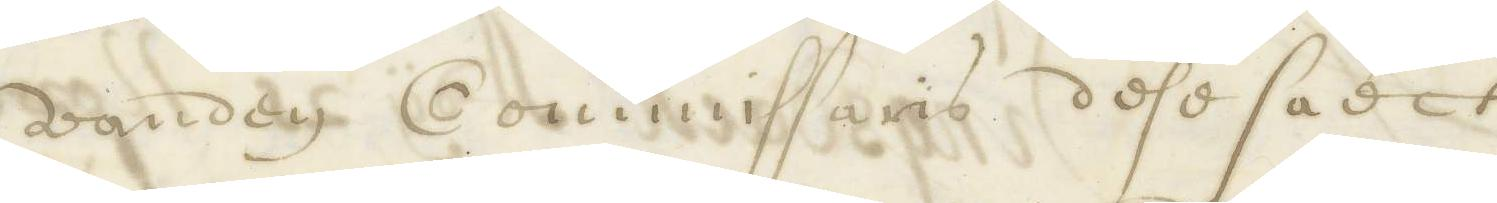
van den Commissaris dese saeck
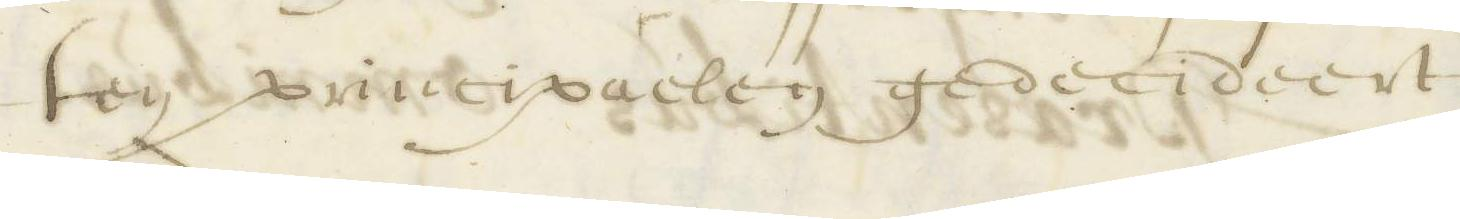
ten principaelen gedecideert te
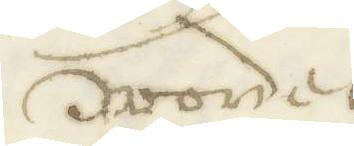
worden,
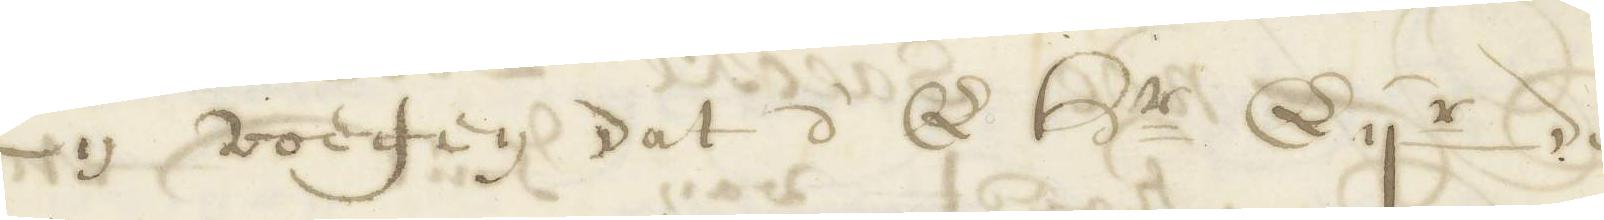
Jn voegen dat d'E H=r Eij=r den
